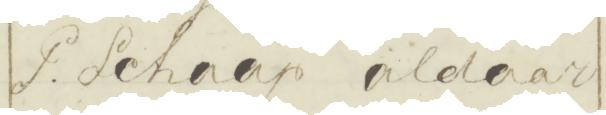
J. Schaap aldaar
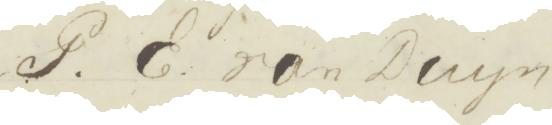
P. E: van Duyn
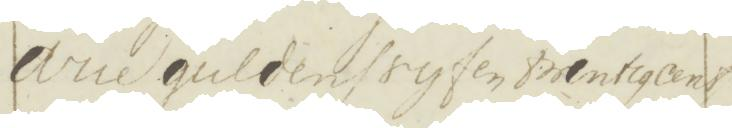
drie guldens vyf en twintig cens
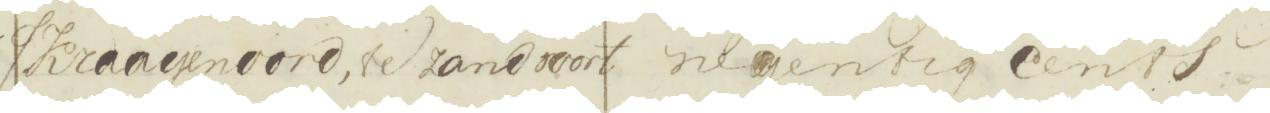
J Kraayenoord, te zandvoort negentig cents
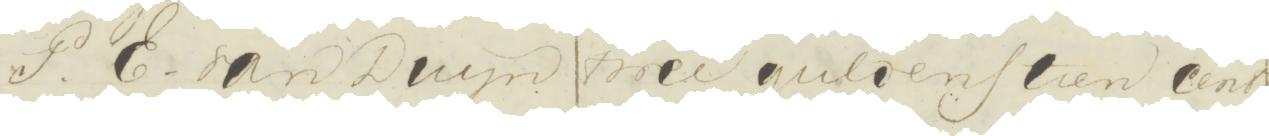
P: E: van Duyn twee guldens tien cents
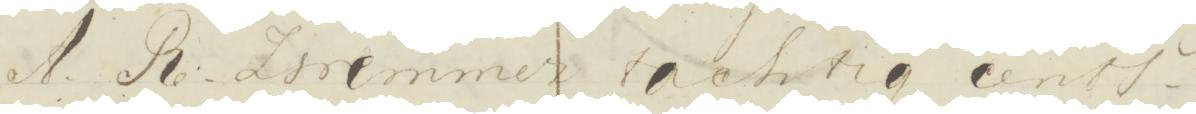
A.R. Zwemmer tachtig cents.
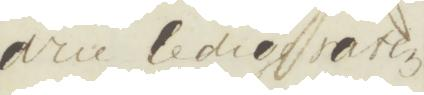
drie ledige vaten
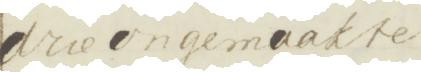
drie ongemaakte
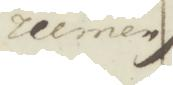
riemen
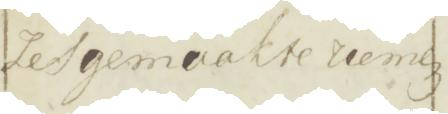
Zes gemaakte riemen
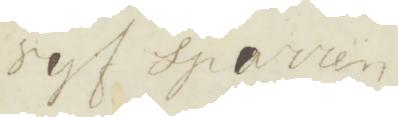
vyf sparren
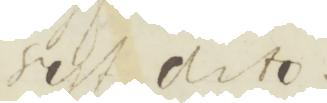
vyf dito.
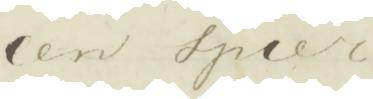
een spier
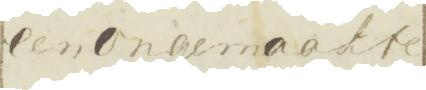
een ongemaakt
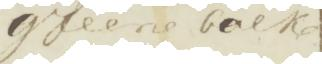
greene boek
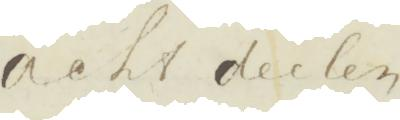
acht deelen
